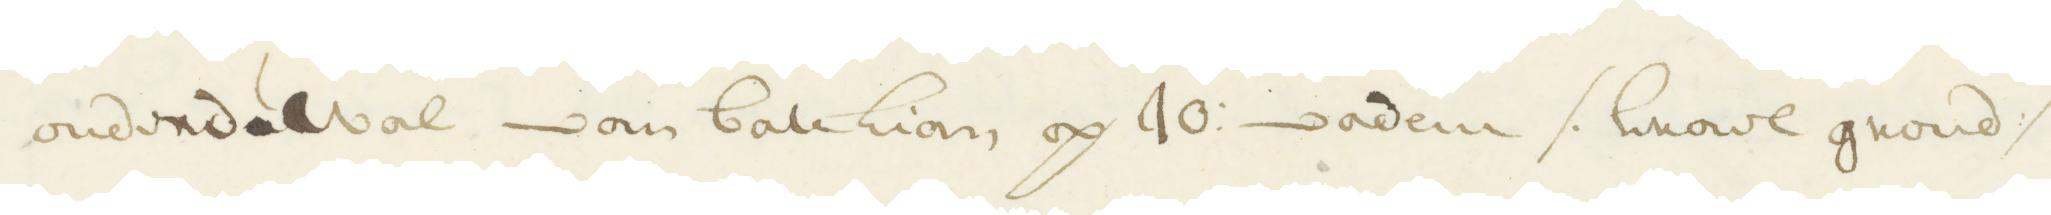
onderdewal van batchian op 40: vadem /:krael grond:/
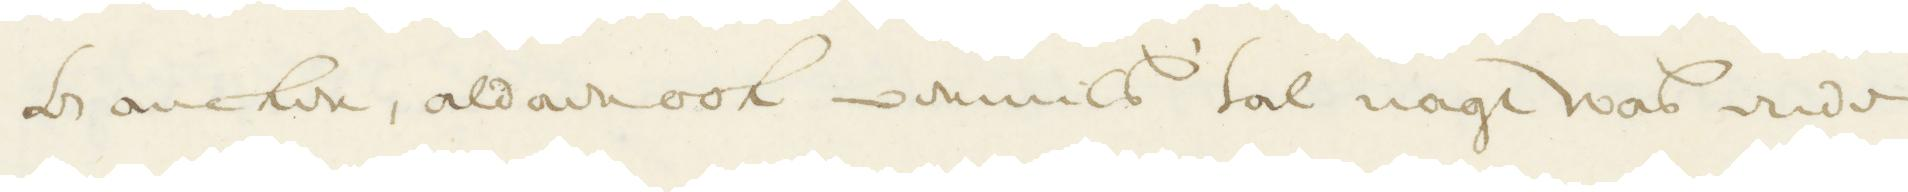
ten ancker, aldaer ook vermits 'tal nagt was ende
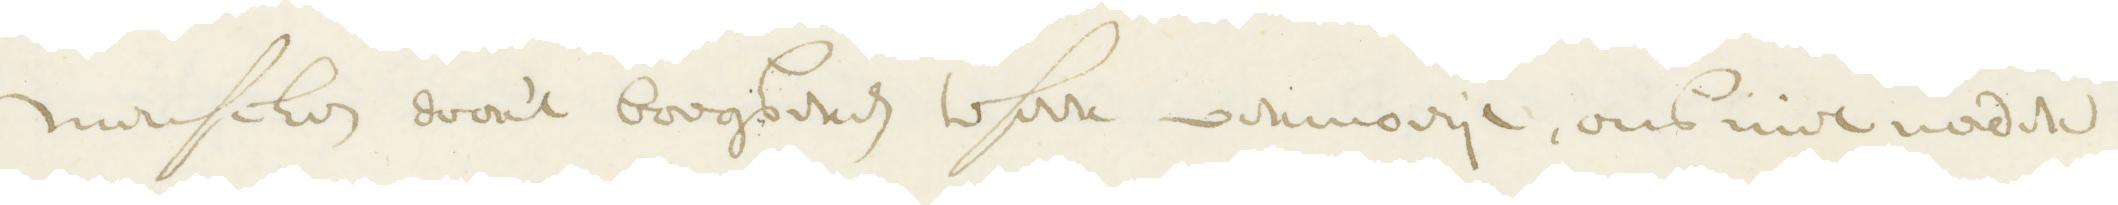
menschen door ’t boegseren te seer vermoeijt, ons niet nader
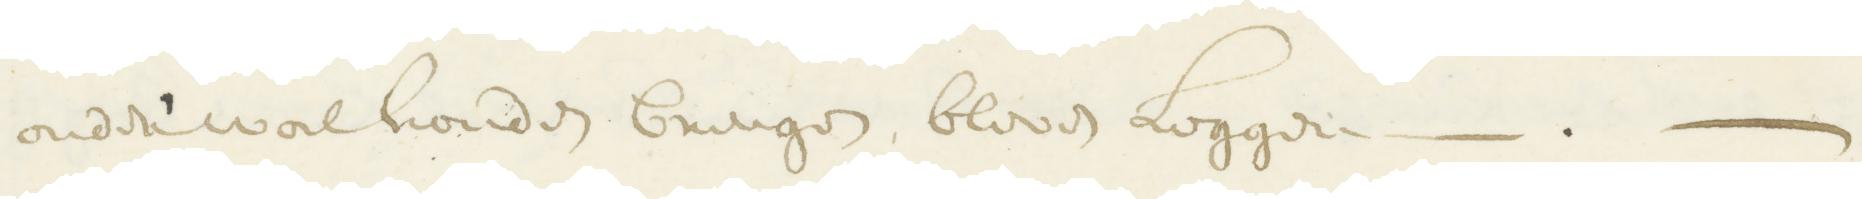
onder wal konden brengen, bleven leggen—. —
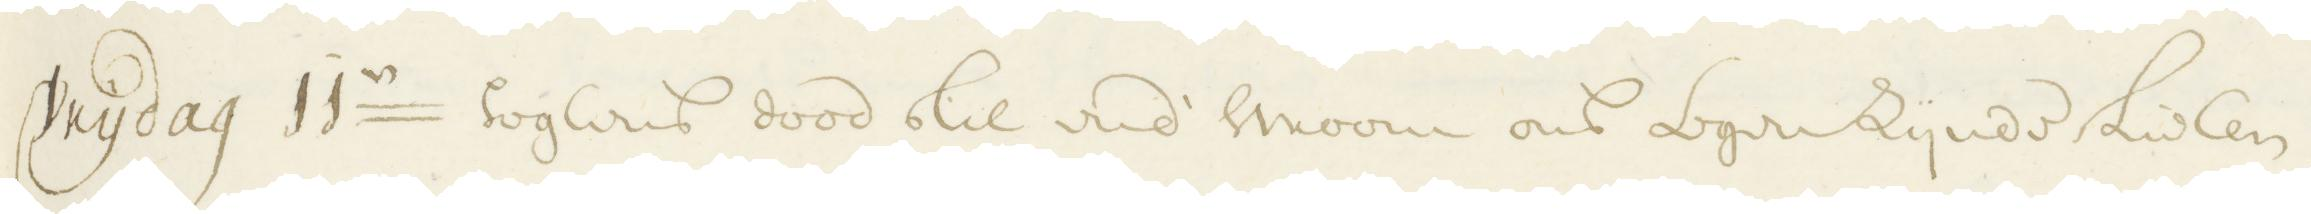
Vrijdag 11=en sogtens dood stil end’ stroom ons tegen zijnde lieten
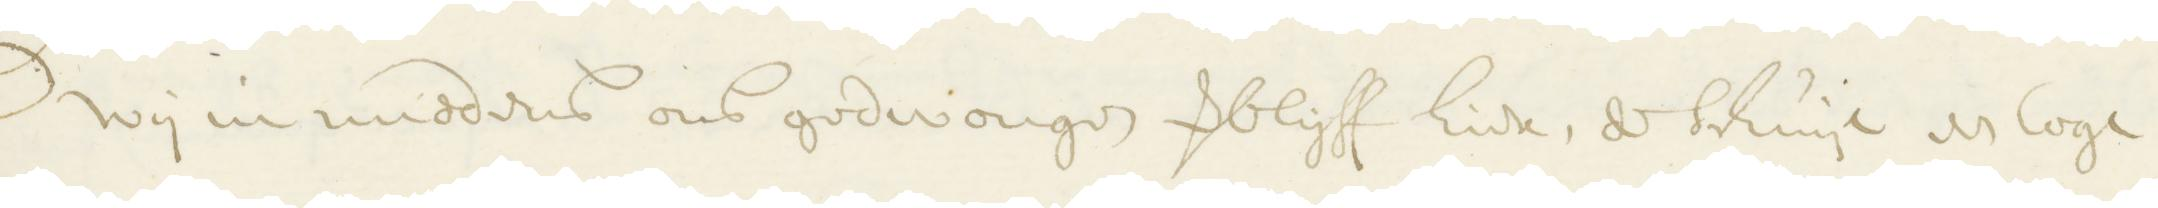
wij in middens ons gedwongen verblijff hier, de schuijt een togt
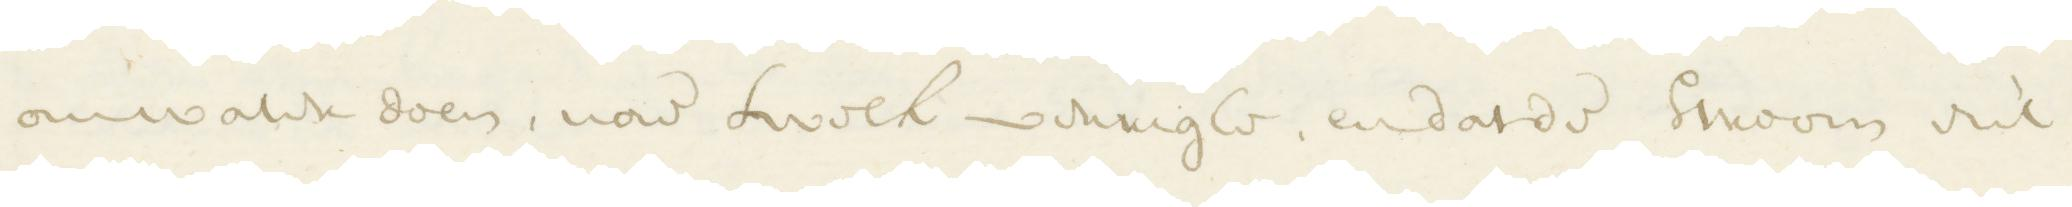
om water doen, nae twelk verrigte, en dat de stroom en’t
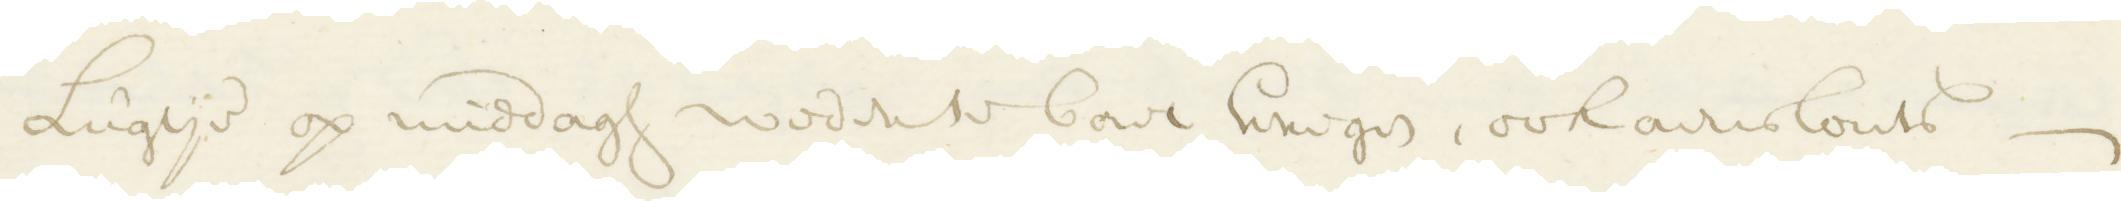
Lugtje op middagh weder te baet kregen, ook aenstonts —
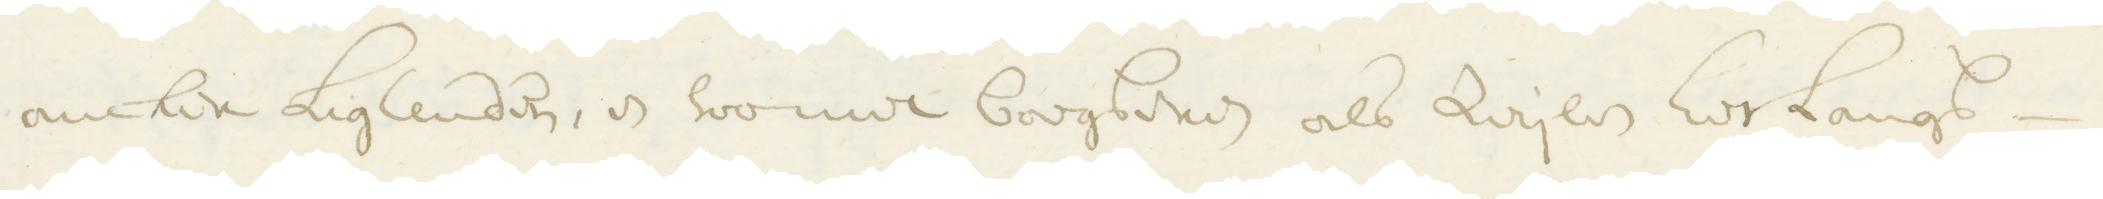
ancker ligtenden, en soo met boegseren als zeijlen het langs —
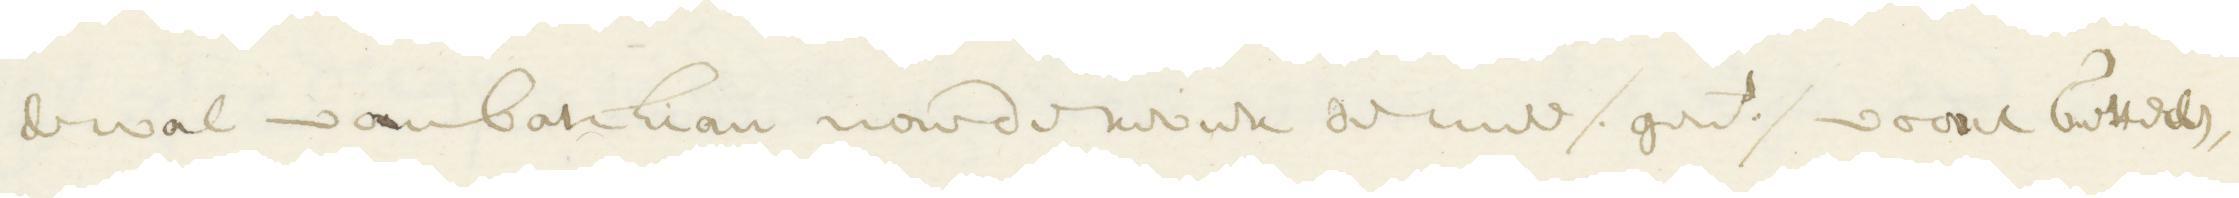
de wal van batchian nae de revier de mee /.gent„/ voort setteden,
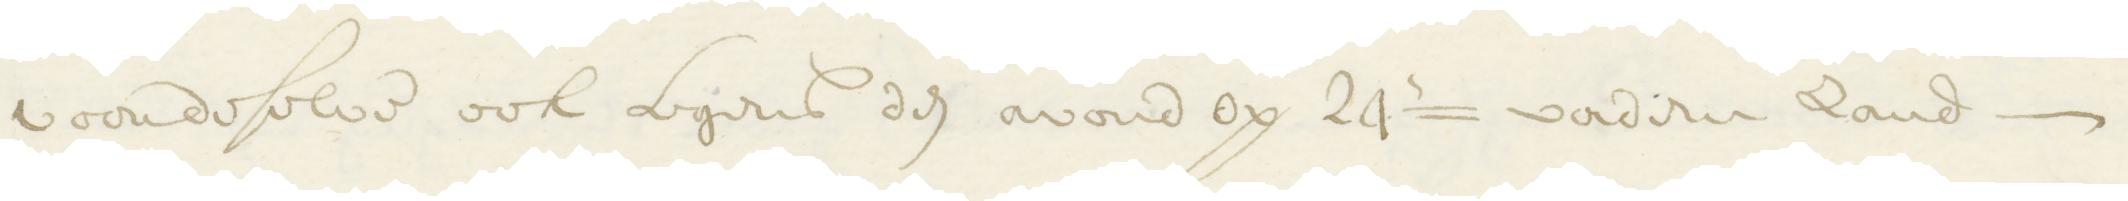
voor deselve ook tegens den avond op 24=' vadem zand —
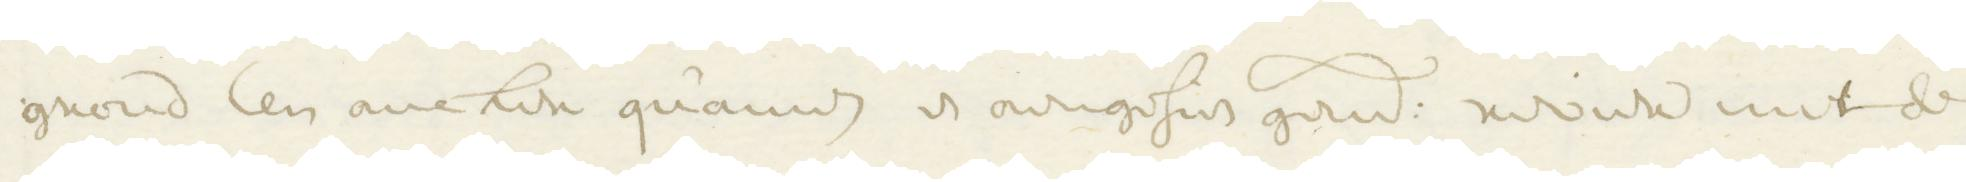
grond ten ancker quamen en aengesien gem: revier met de
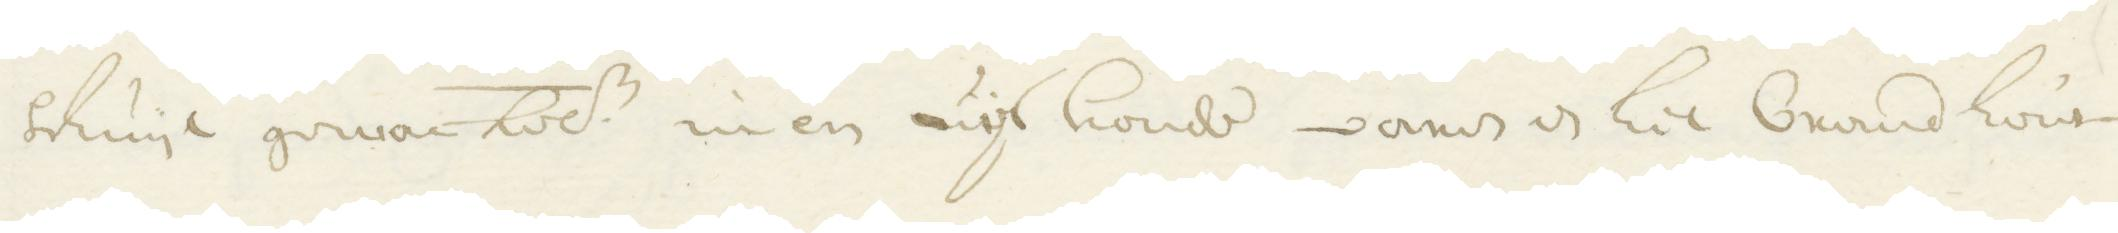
schuijt gemackelijk in en uijt konde varen en het brand hout
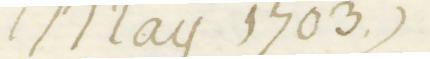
Maij 1703.—
